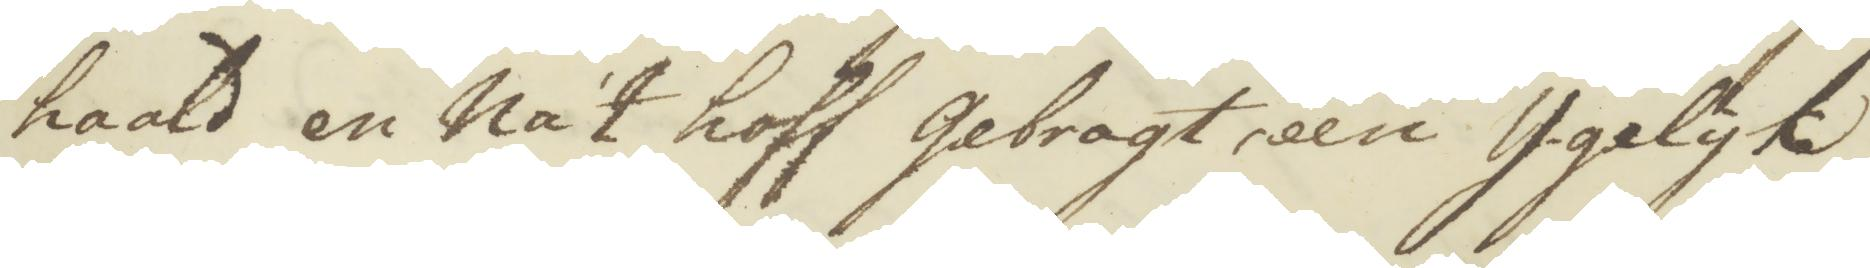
haald en na ’t hoff gebragt, een IJgelijk
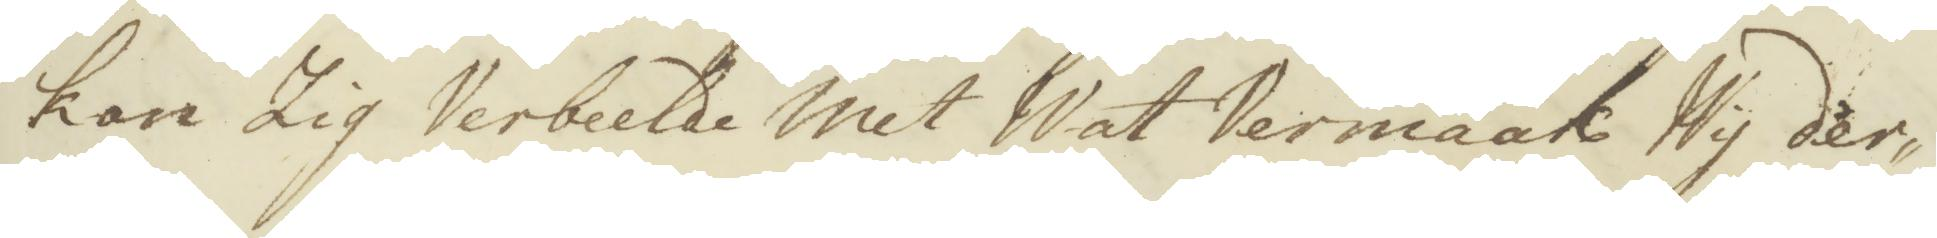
kan zig verbeelde met wat vermaak wij der„
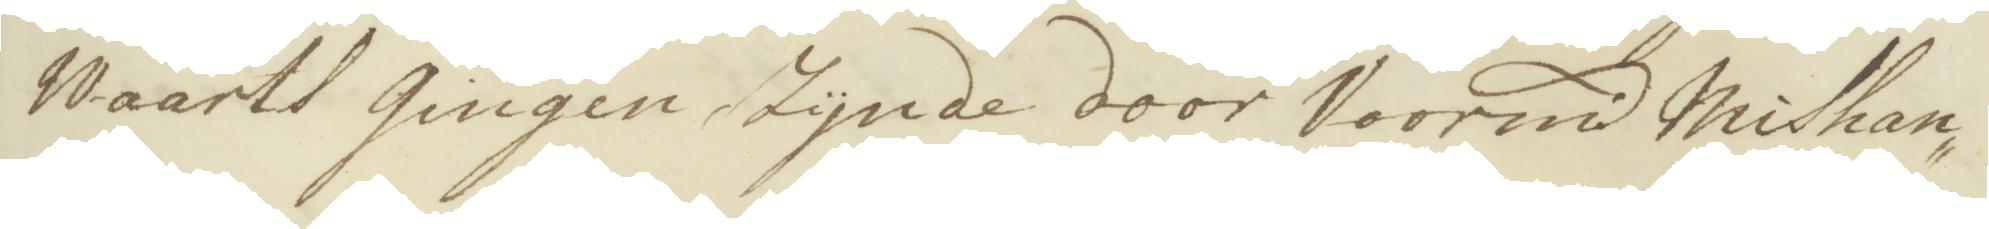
waarts gingen, zijnde door voorm: mishan„
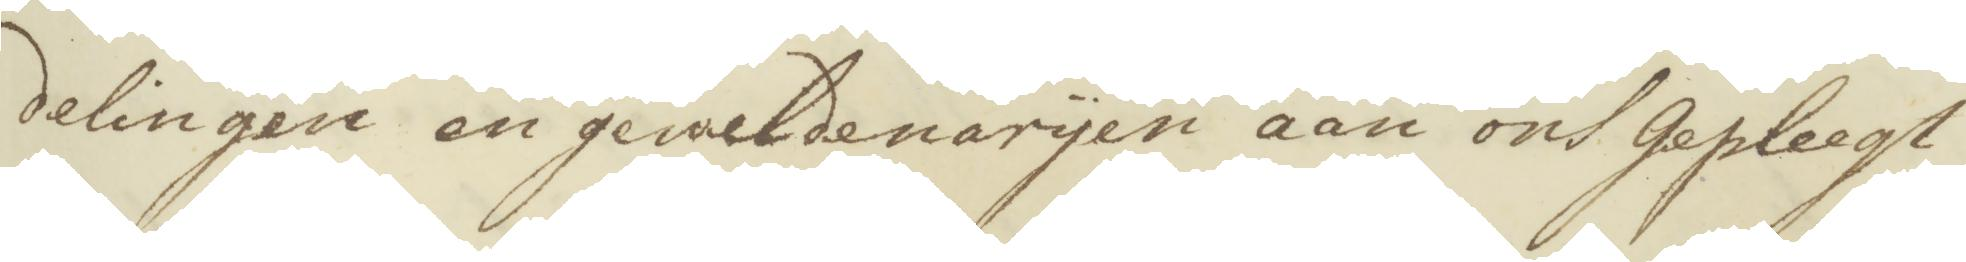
delingen en geweldenarijen aan ons gepleegt
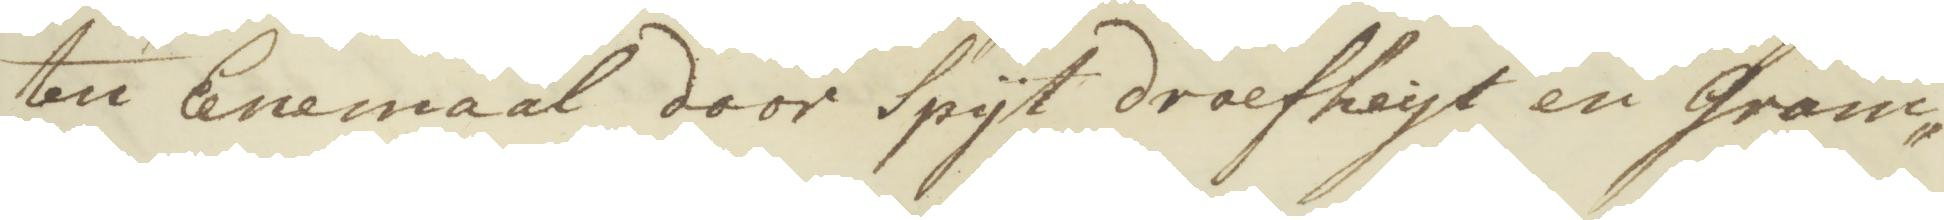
ten Eenemaal door spijt droefheijt en gram„
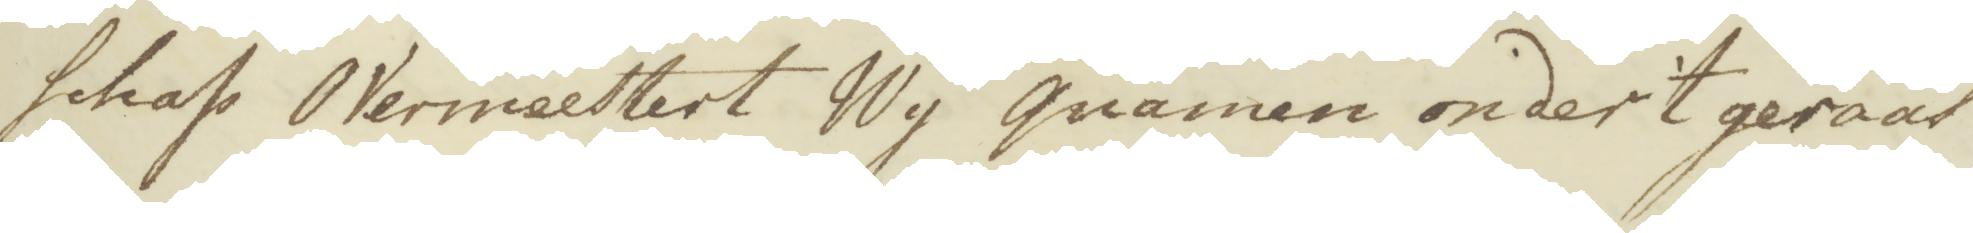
schap overmeestert wy quamen onder ’t geraas
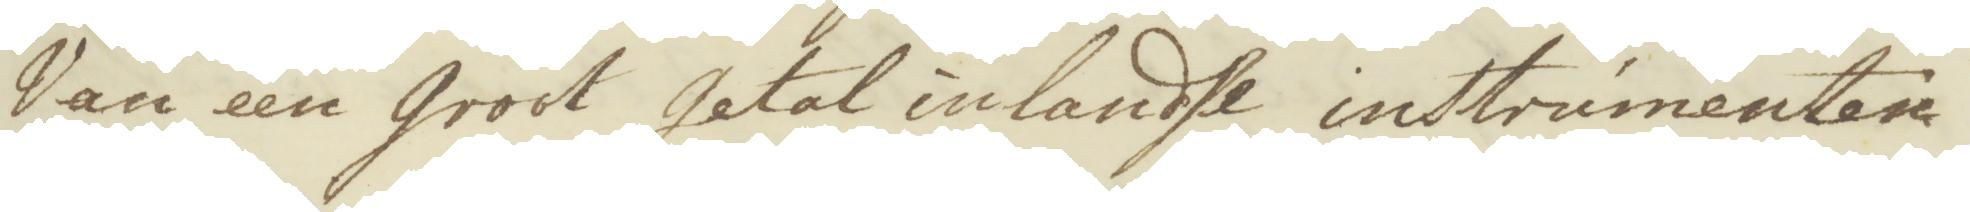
van een groot getal inlandse instrumenten
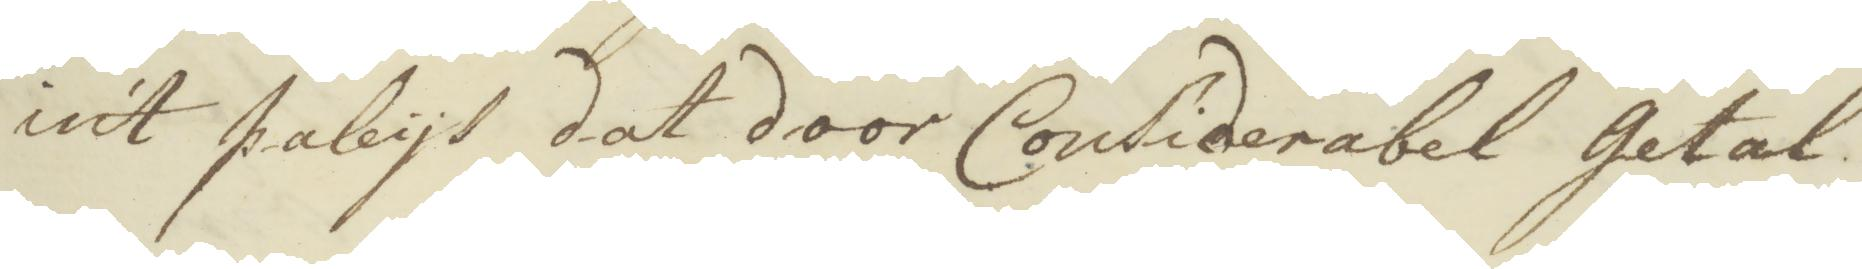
in’t paleijs dat door Considerabel getal.
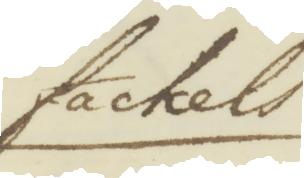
fackels
